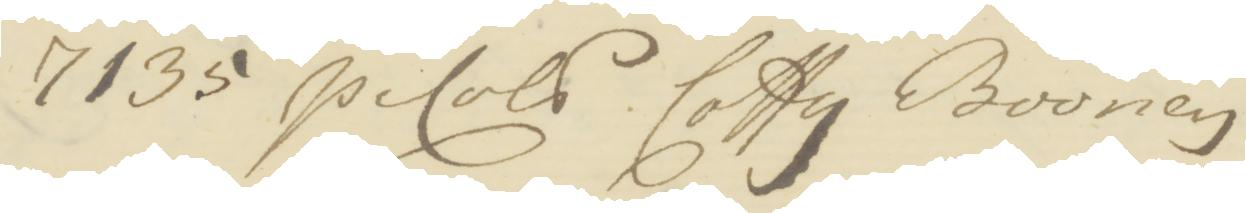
7135 picols. Coffy Boonen
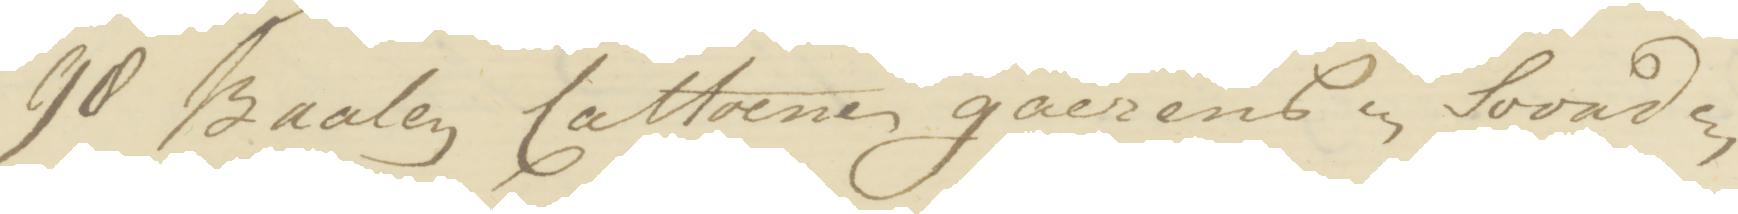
98 Baalen Cattoene gaerens en soorden
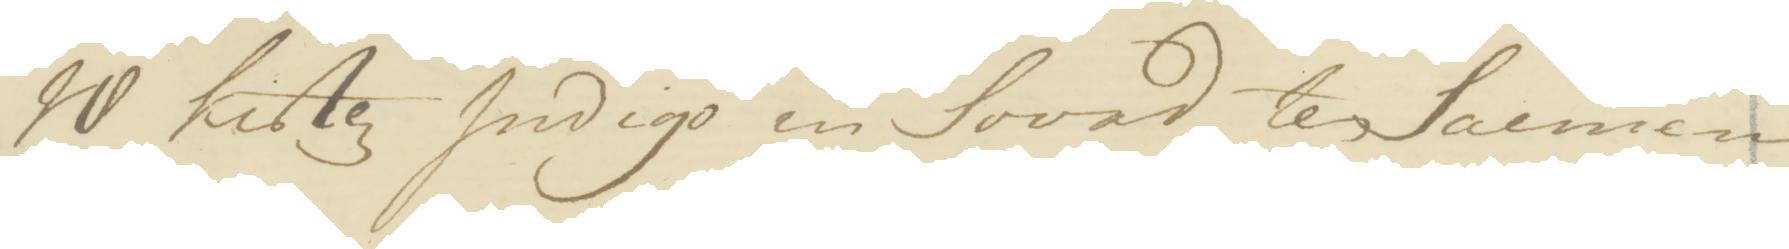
18 kisten Jndigo en soord, te saemen
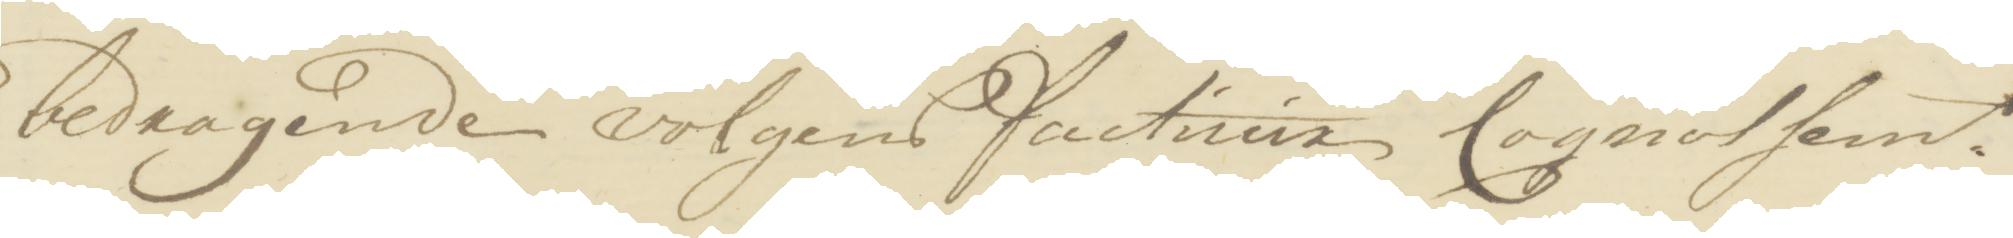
bedragende volgens factuur Cognossem:t
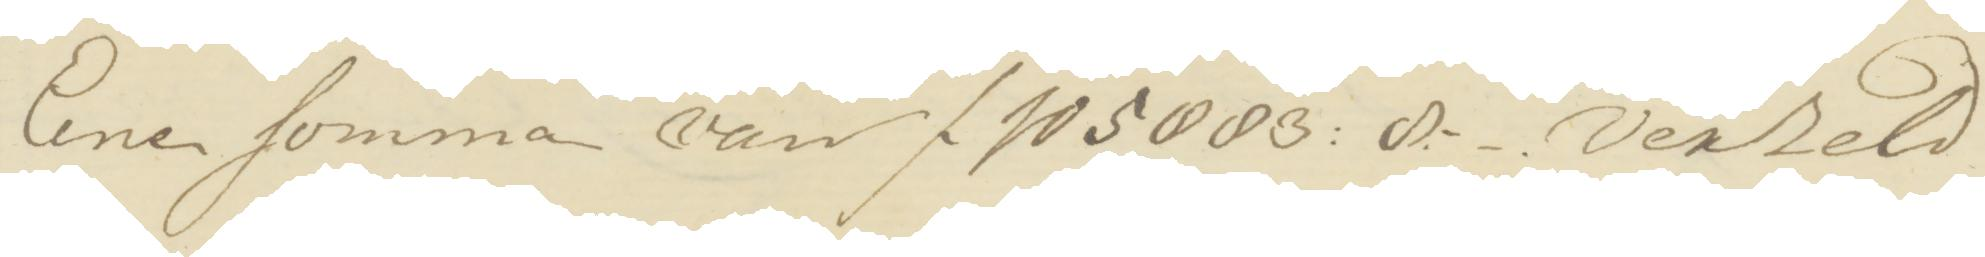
Eene somma van ƒ105883: 8: —. verzeld
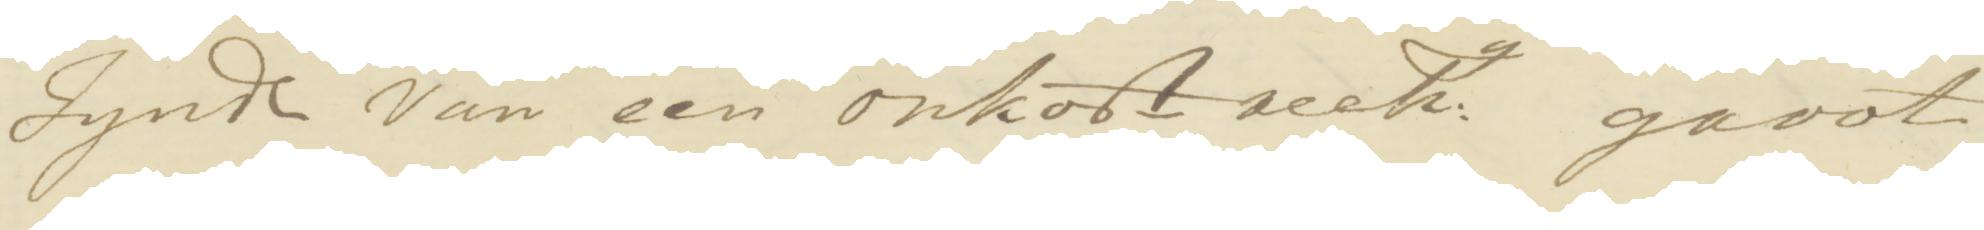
zynde van een onkost reek:g groot
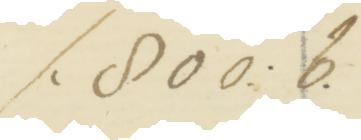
ƒ800: 6.
